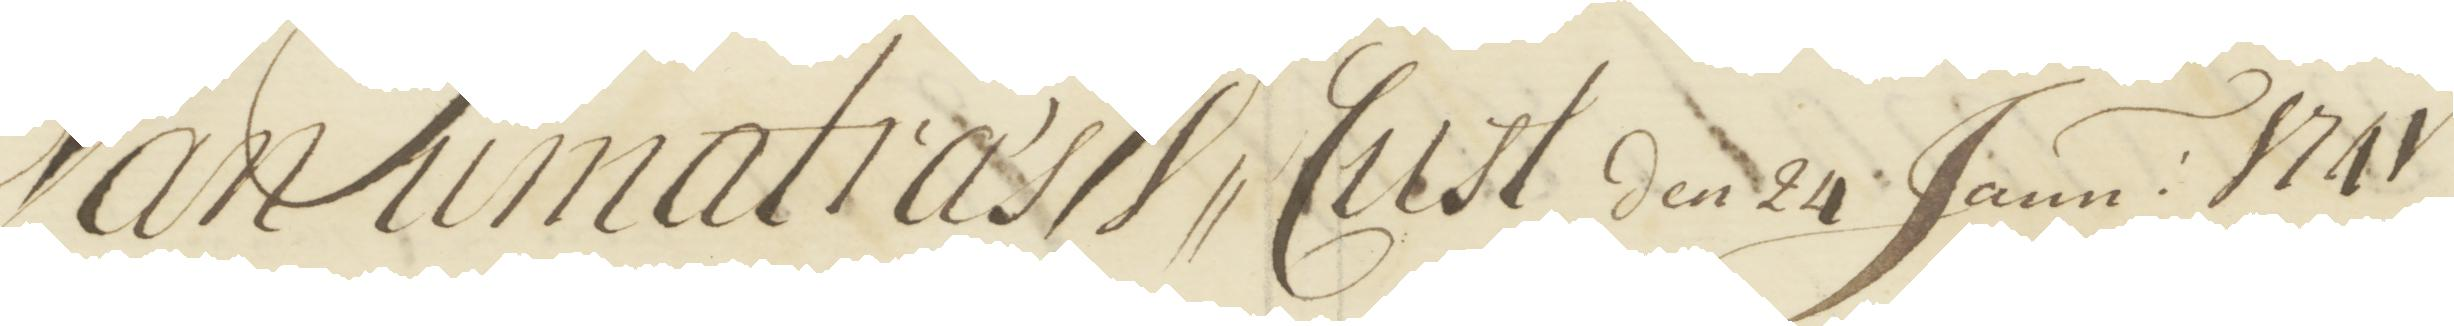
Van Sumatra's W„t Cust den 24: Jann: 1741
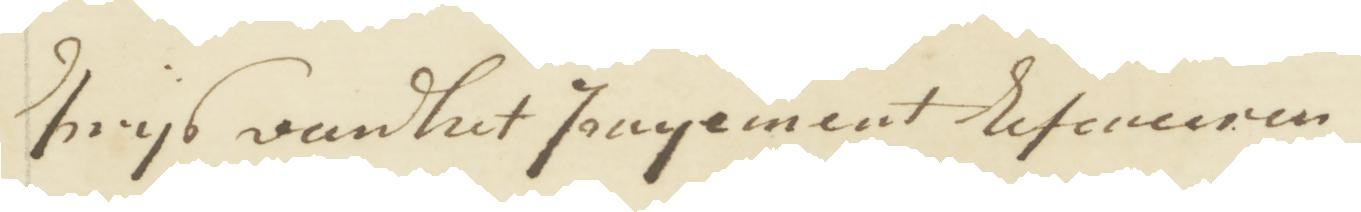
'prijs van het payement refereeren
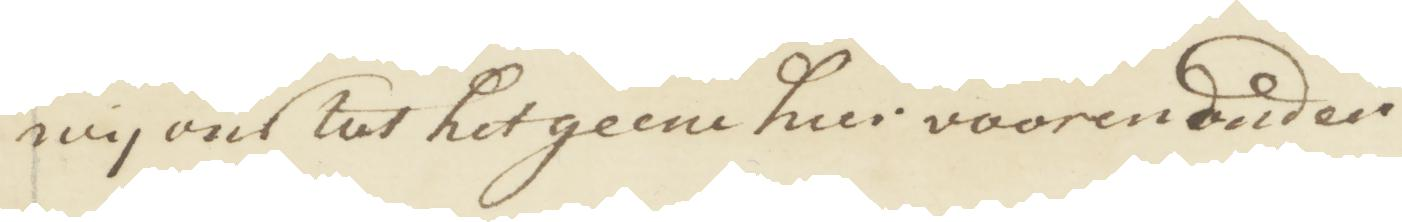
wij ons tot het geene hier vooren onder
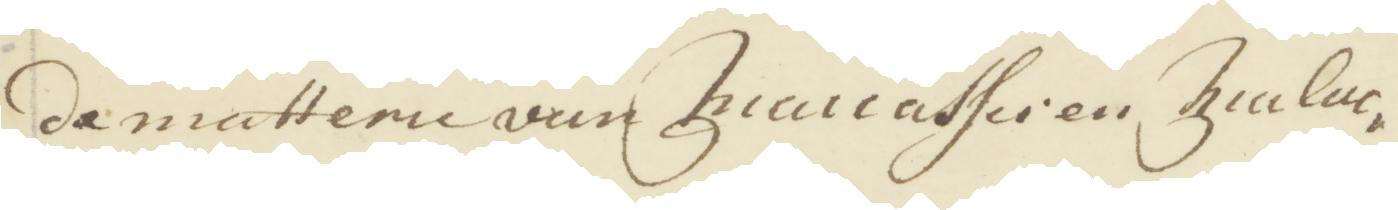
de matterie van maccasser en malac„
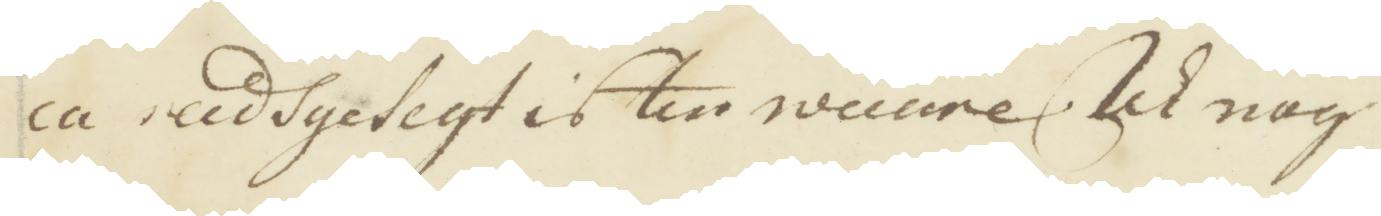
ca reeds gesegt is ten waare UE nog
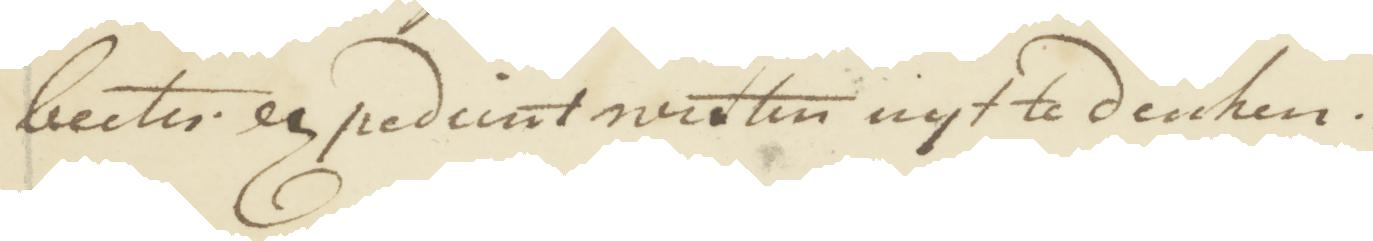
beeter expedient wisten uyt te denken.
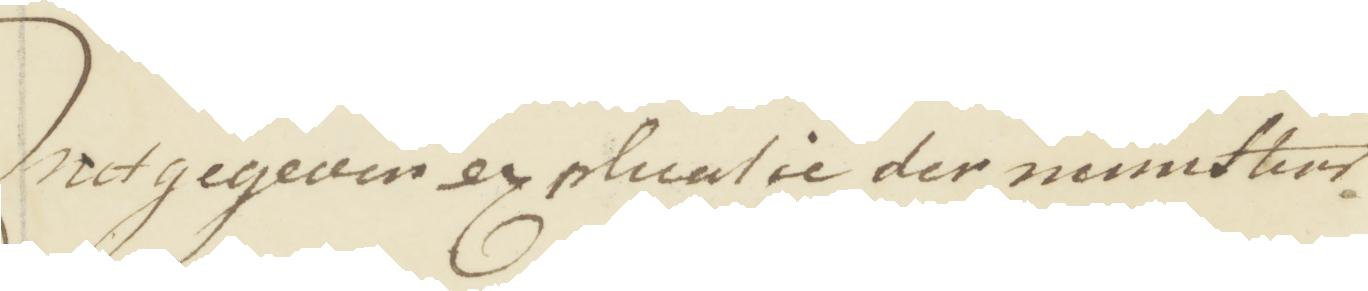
Met gegeven explicatie der ministers
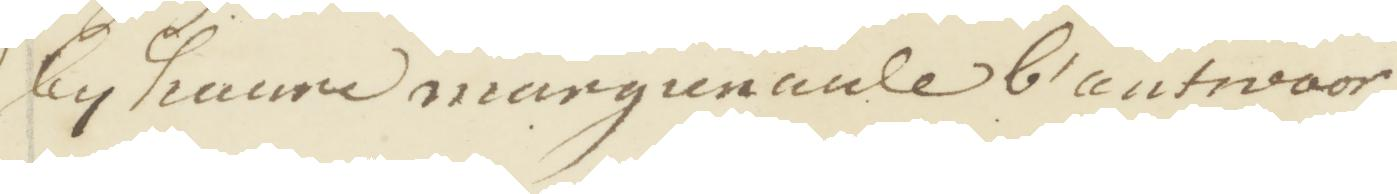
by haare margienaale b'antwoor
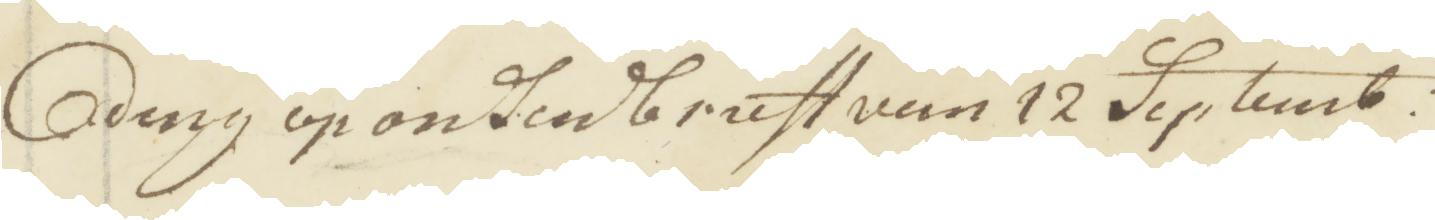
ding op onsen brieff van 12 Septemb:
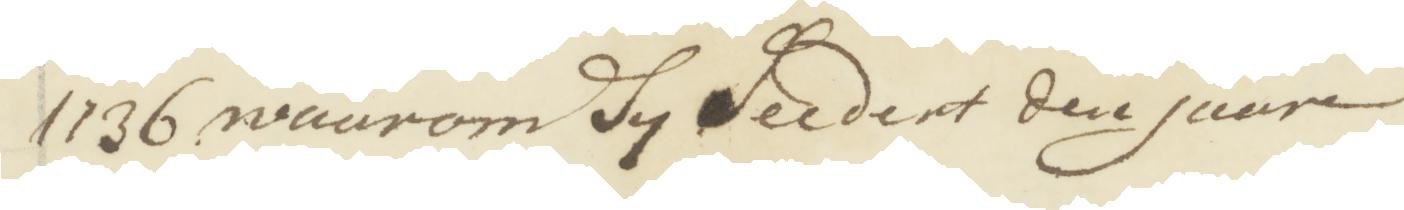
1736 waarom sy seedert den jaar
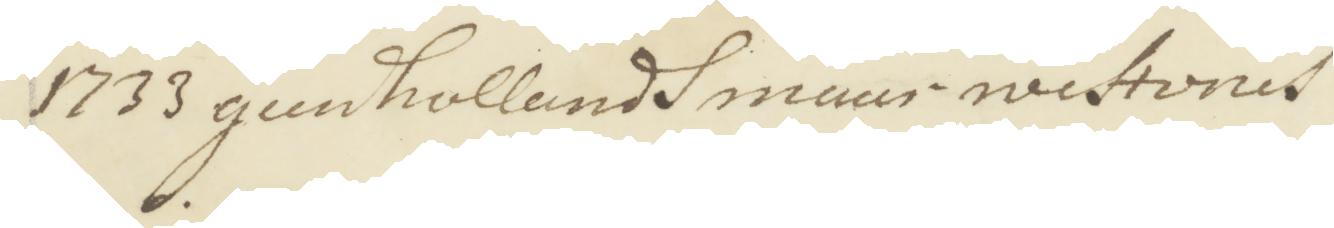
1733 geen hollands maar westvries
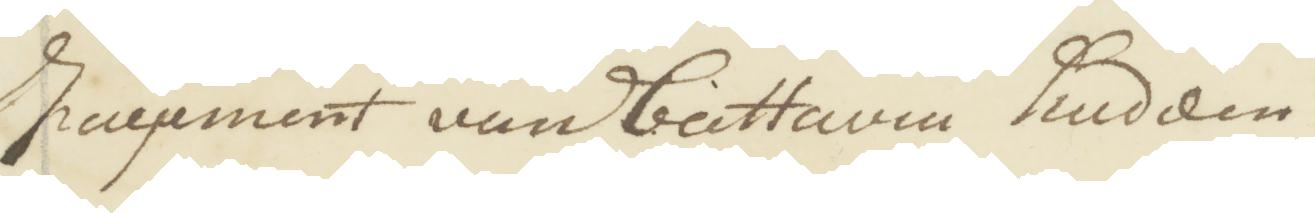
paijement van Battavia hadden
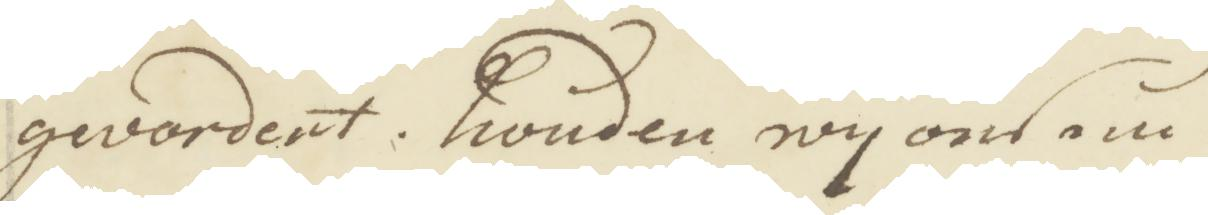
gevordert. houden wy ons nu
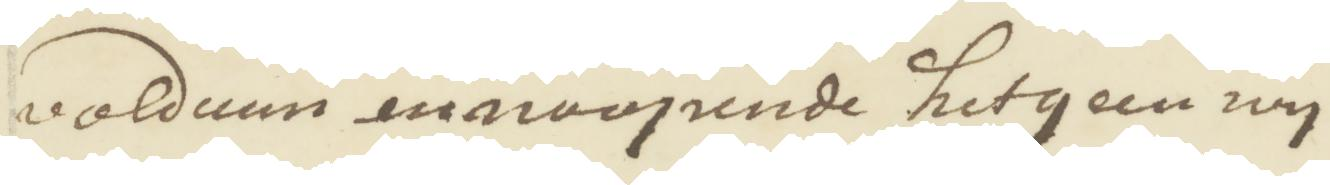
voldaan en noopende hetgeen wij
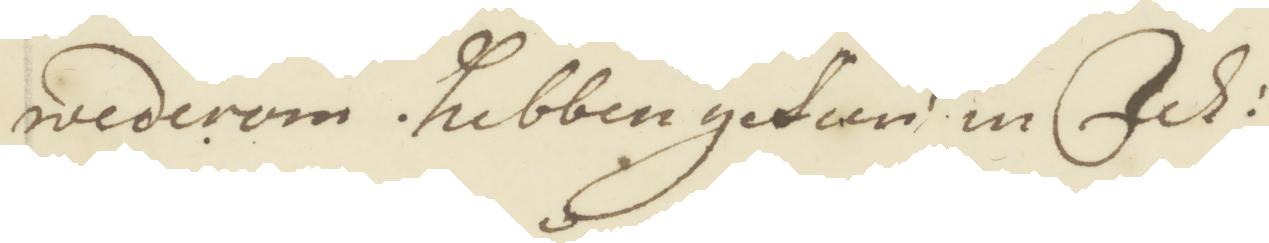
wederom hebben gesien in UE:
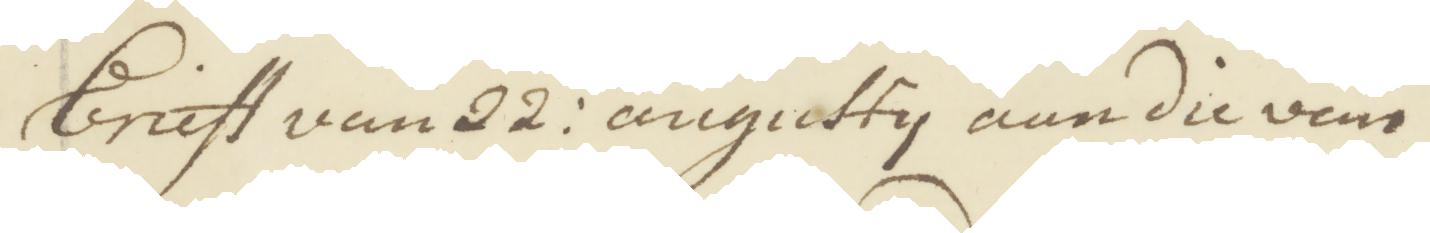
brieff van 22:' augusty aan die van
